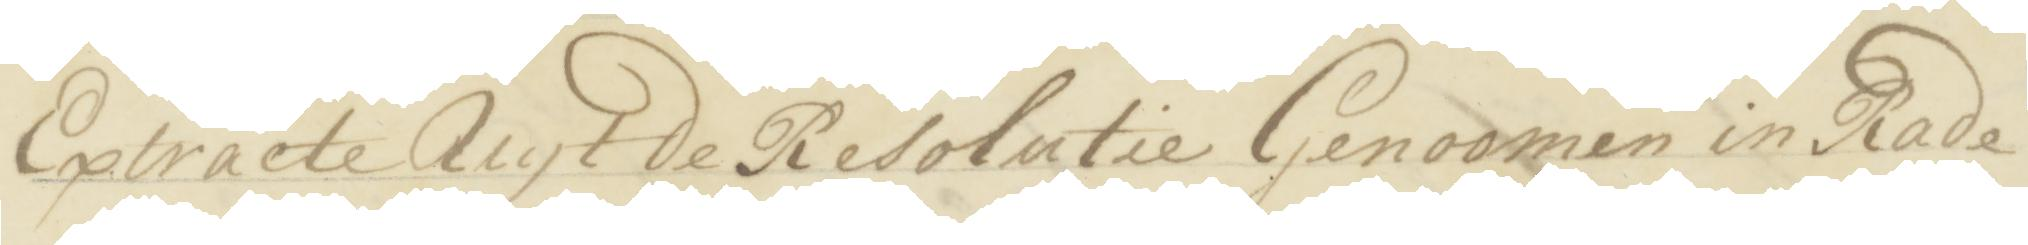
Extracte uijt de Resolutie Genoomen in Rade
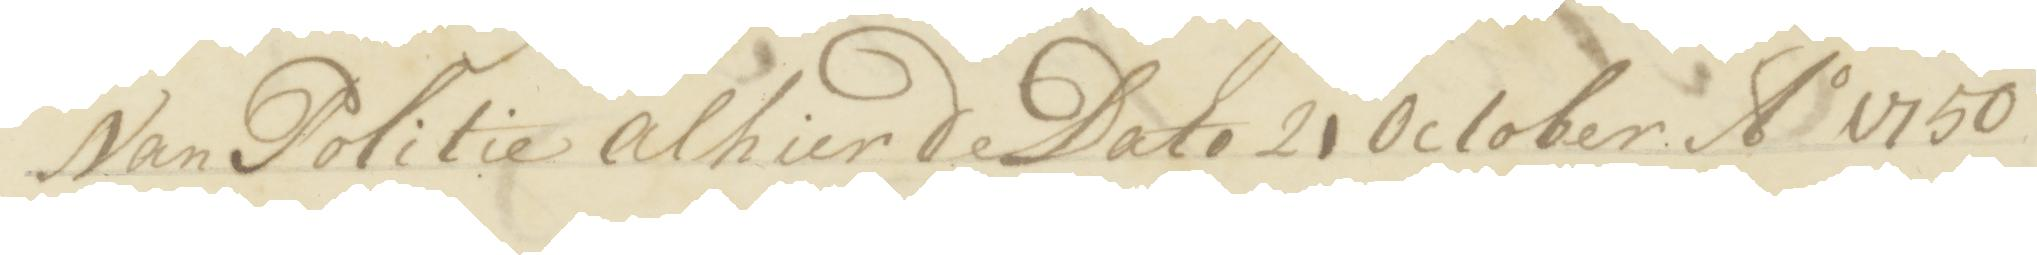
van Politie alhier de Dato 21 october Ao 1750
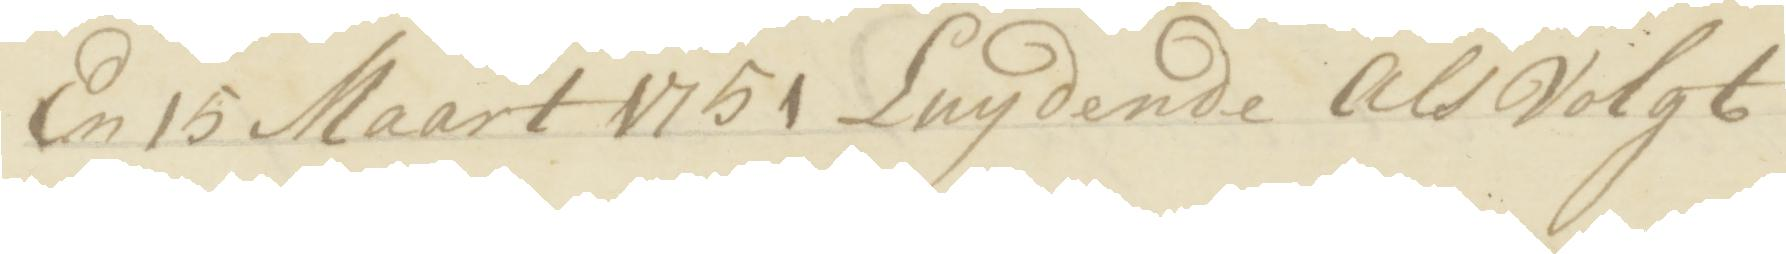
En 15 Maart 1751 Luydende als volgt
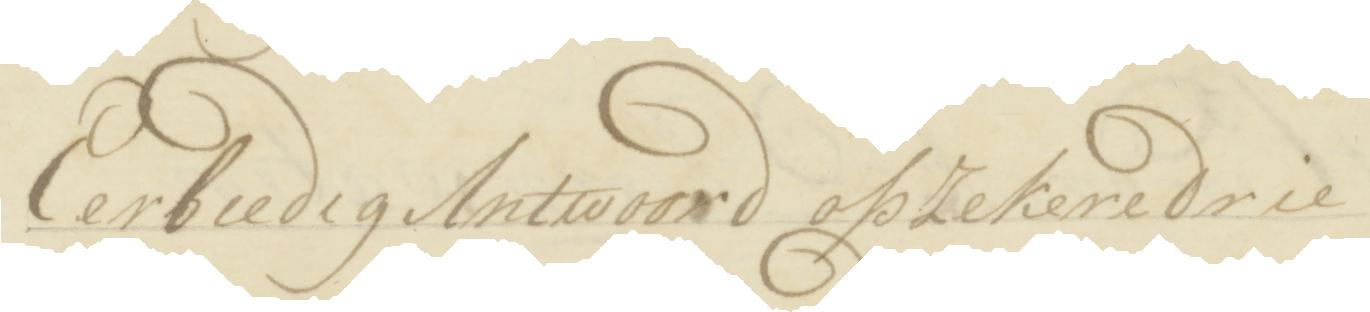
Eerbedig Antwoord op zekere drie
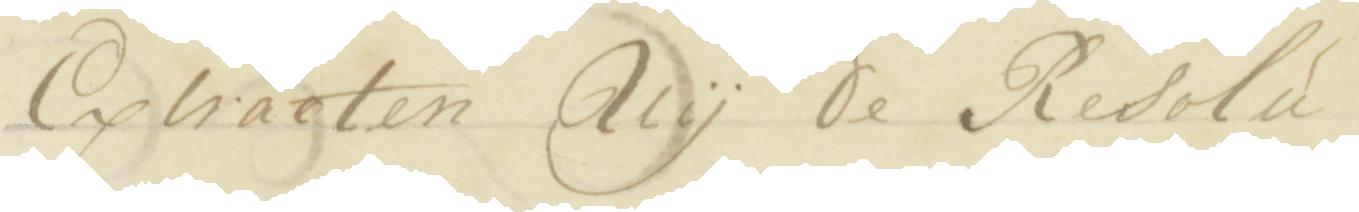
Extracten Uij de Resolu
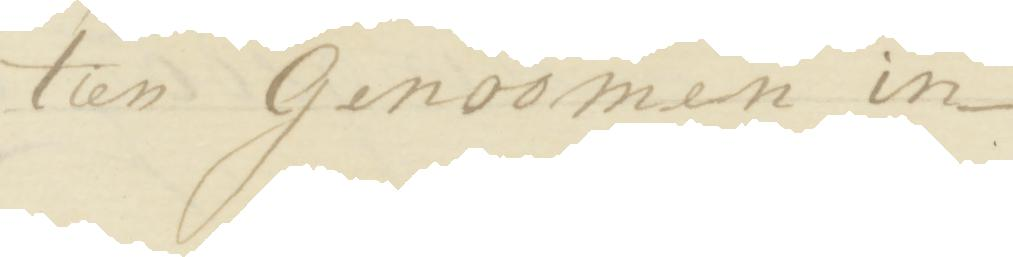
tien genoomen in
